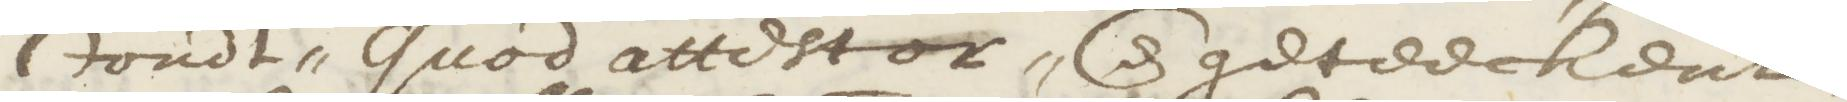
stondt„ quod attestor „ ende geteeckent
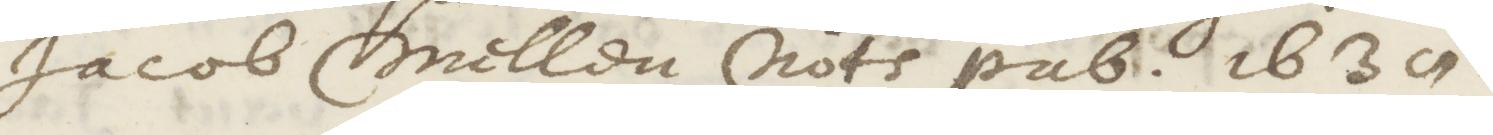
Jacob millen nots pab. 1638
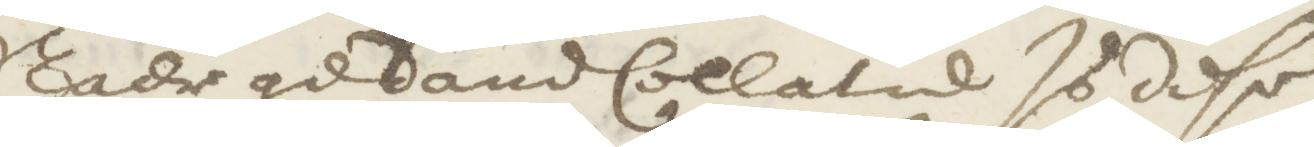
Naer gedane Collatie Js dese
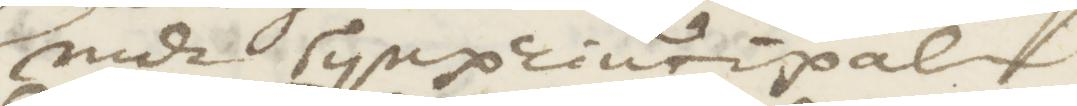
met syn principale
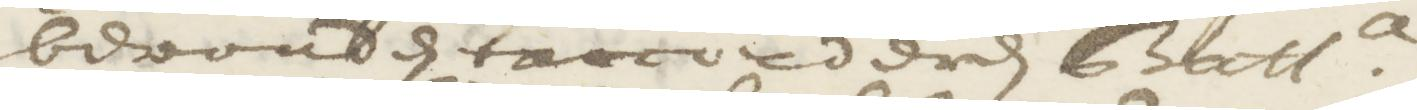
bevonden taccorderen Batt.a
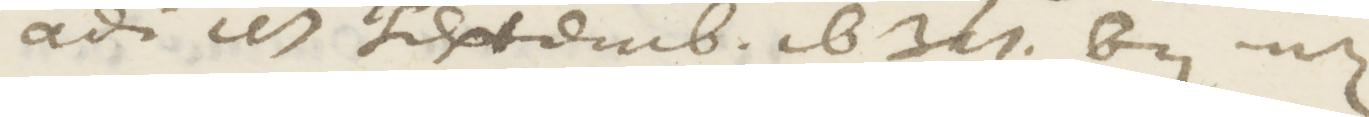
adi een septemb. 1638. by my
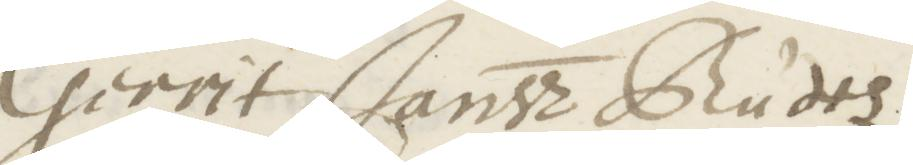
Gerrit Jansz Rudts
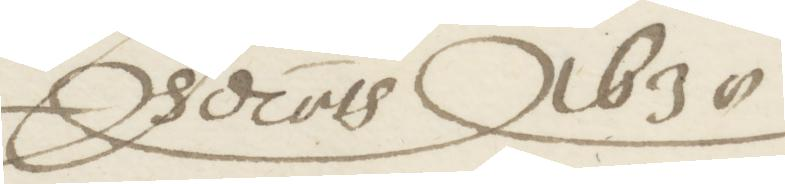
GJruts 1638
